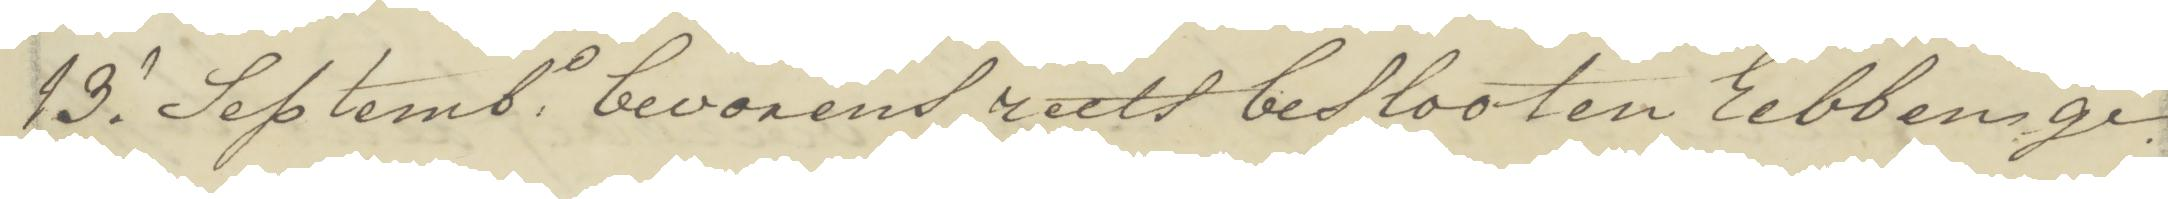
13.' Septemb:r bevorens reets beslooten hebben ge.
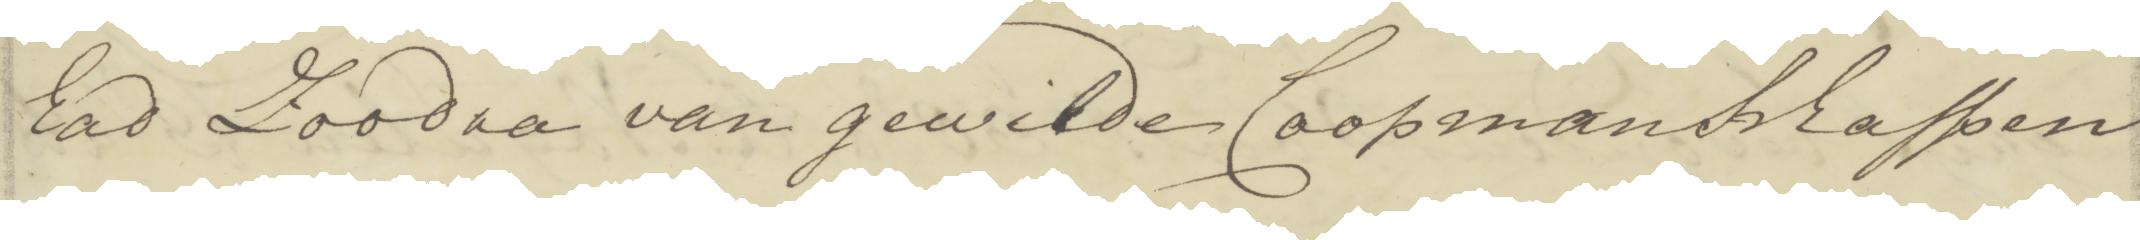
had zoodra van gewilde Coopmanschappen
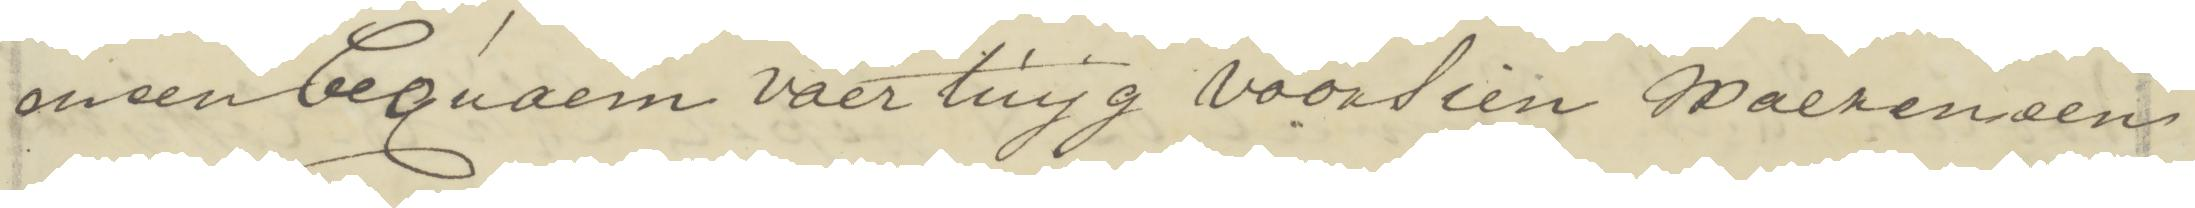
in een bequaem vaertuijg voorsien waeren een
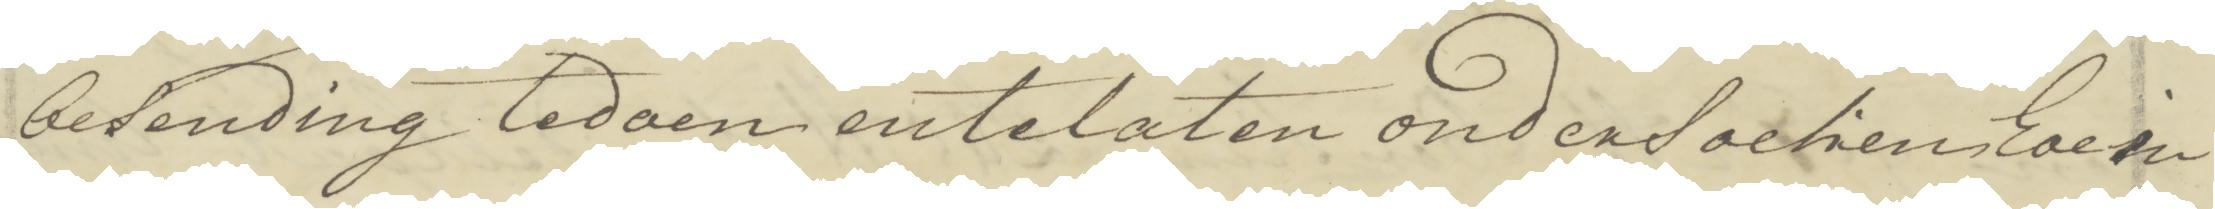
besending te doen en te laten ondersoeken hoe in
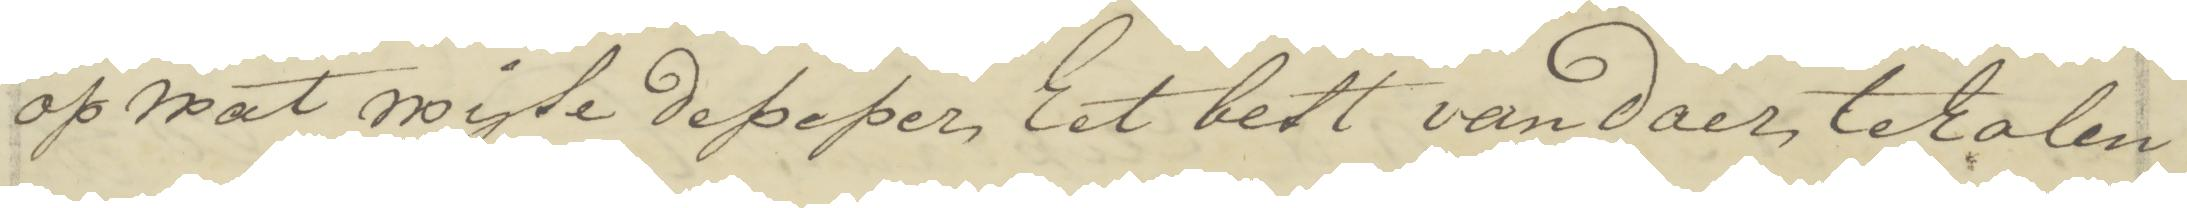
op wat wijse de peper het best van daer te halen
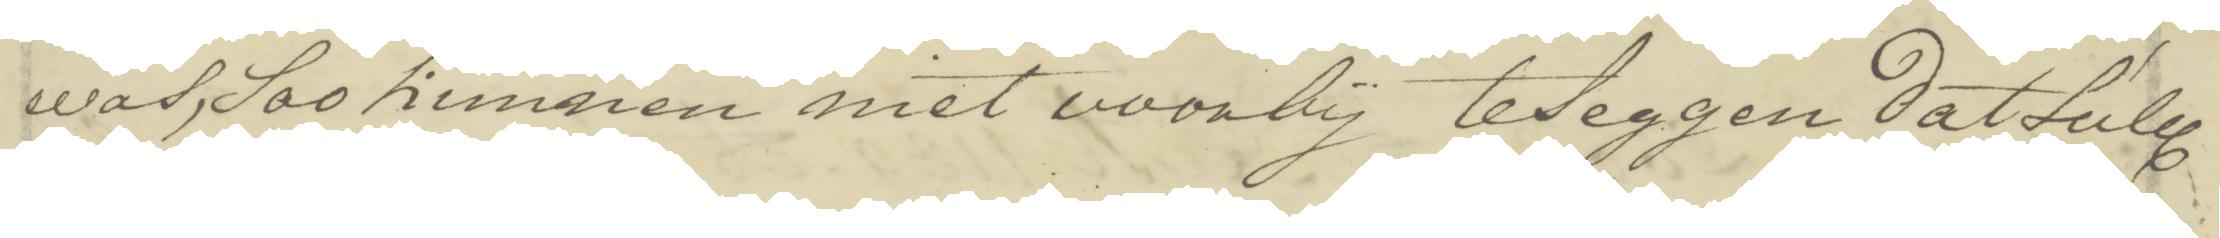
was, soo kunnen niet voorbij te seggen dat sulx
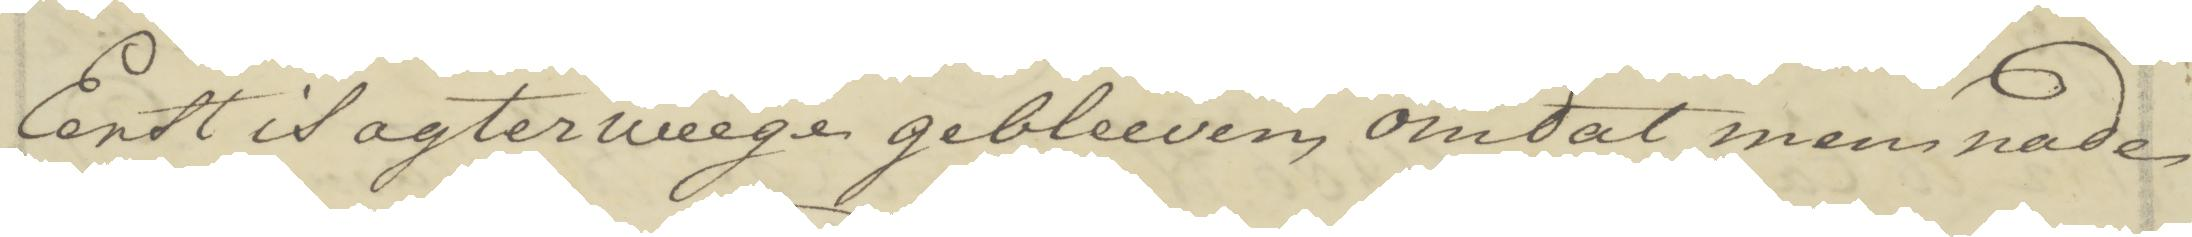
Eerst is agterweege gebleeven, omdat men na de
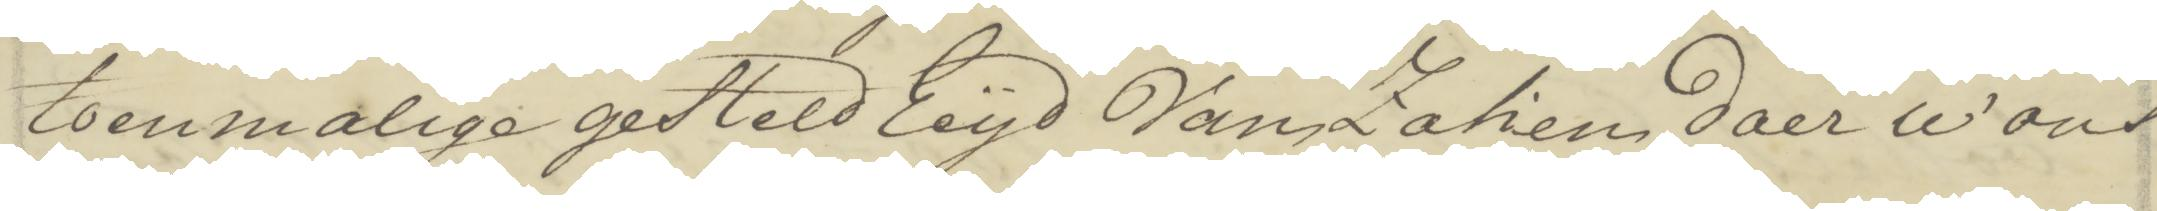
toenmalige gesteldheijd van Zaken daer w' ons
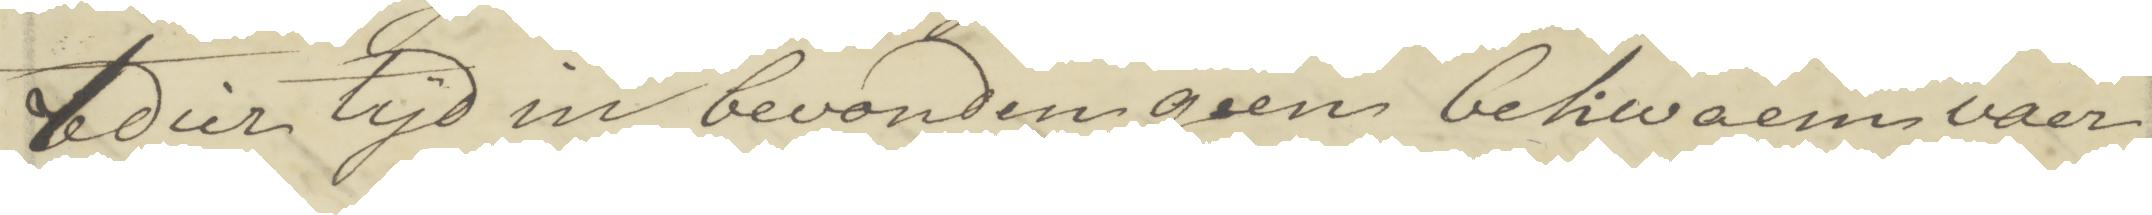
te dier tijd in bevonden geen bekwaem vaer
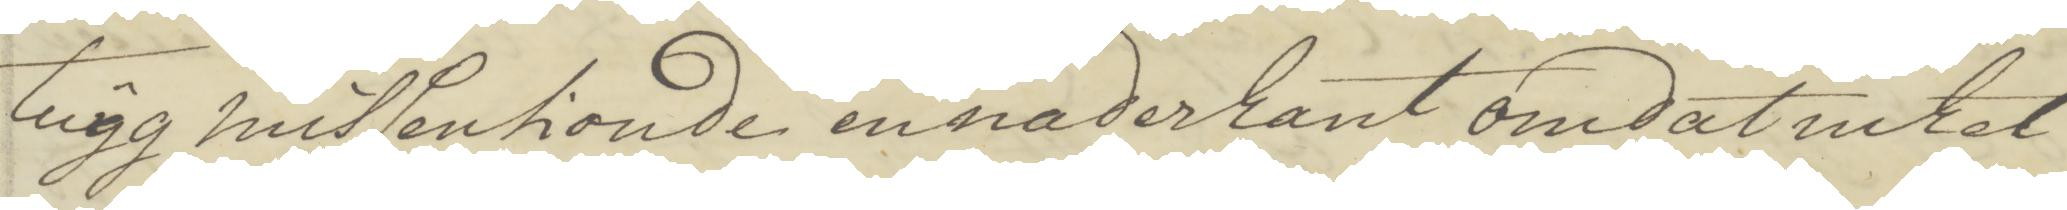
tuijg missen konde en naderhant omdat in het
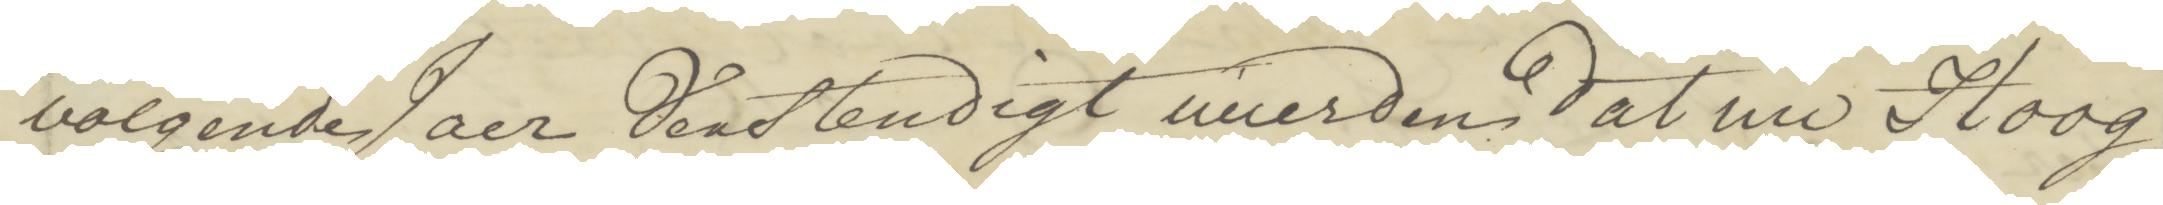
volgende Jaer derstendigt uuerden dat uw Hoog
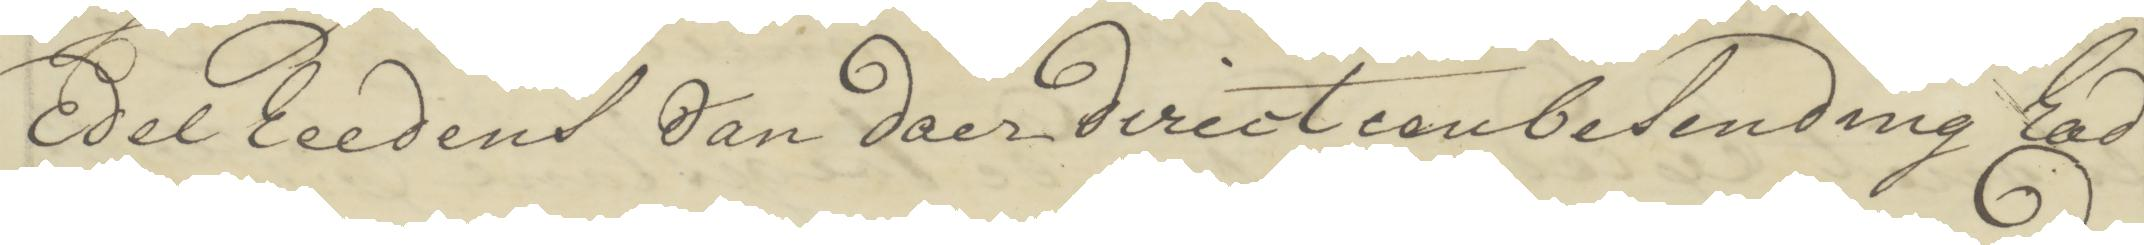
Edelheedens van daer direct een besending had
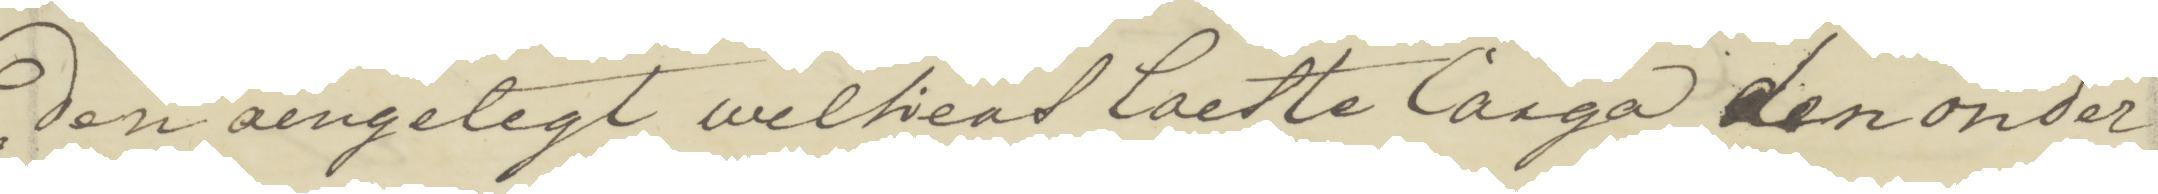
den aengelegt welkers laeste Carga den onder
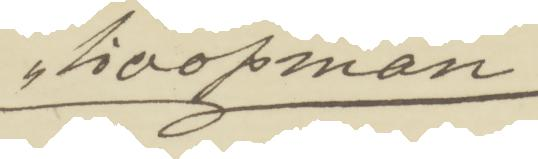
„koopman
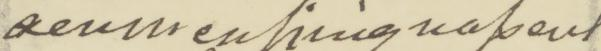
aenmerking nopens
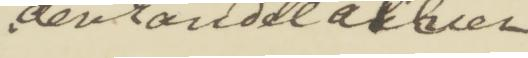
aen handel alhier
